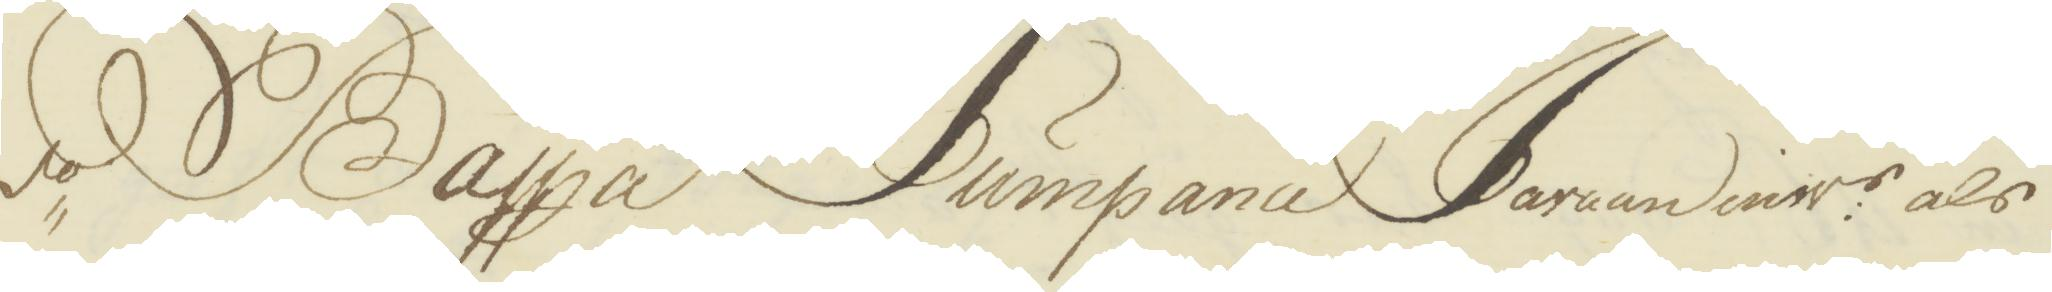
_„o Bappa Jumpana Javaan inw:s als
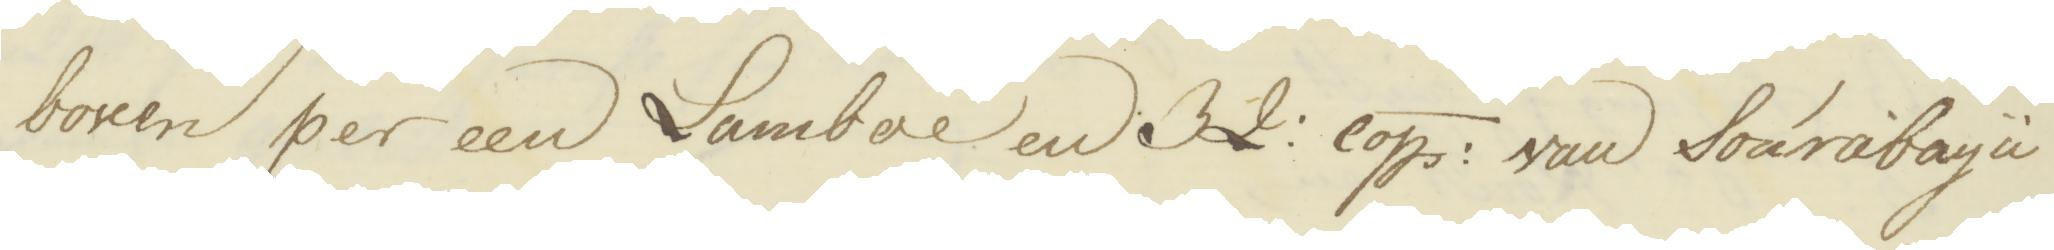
boven per een Lamboe en 32: copp: van Sourabaija
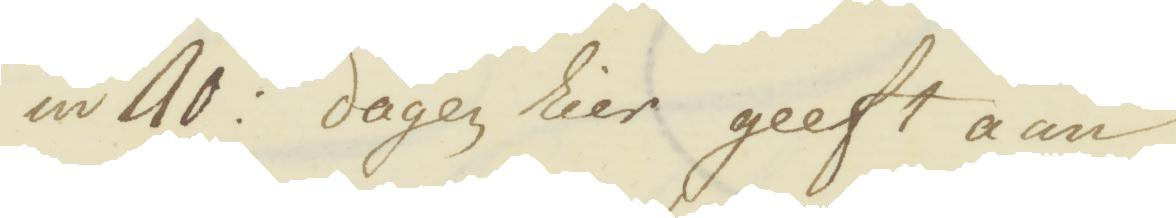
in 40: dagen hier geeft aan
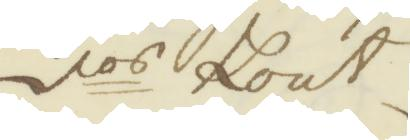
5: _=os zout
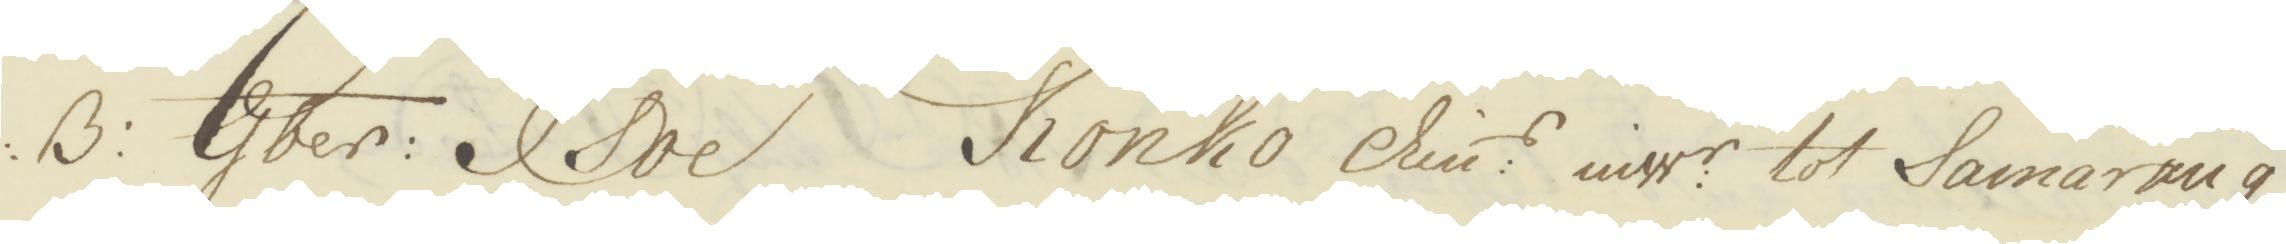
3: 9ber: Tsoe Konko chin:s inw:s tot Samarang
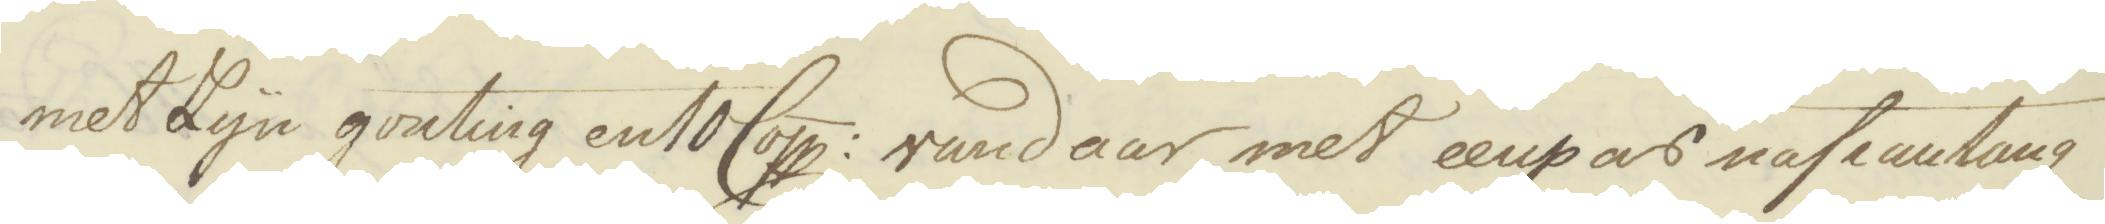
met zijn gonting en 10 Copp: vandaar met een pas na siantang
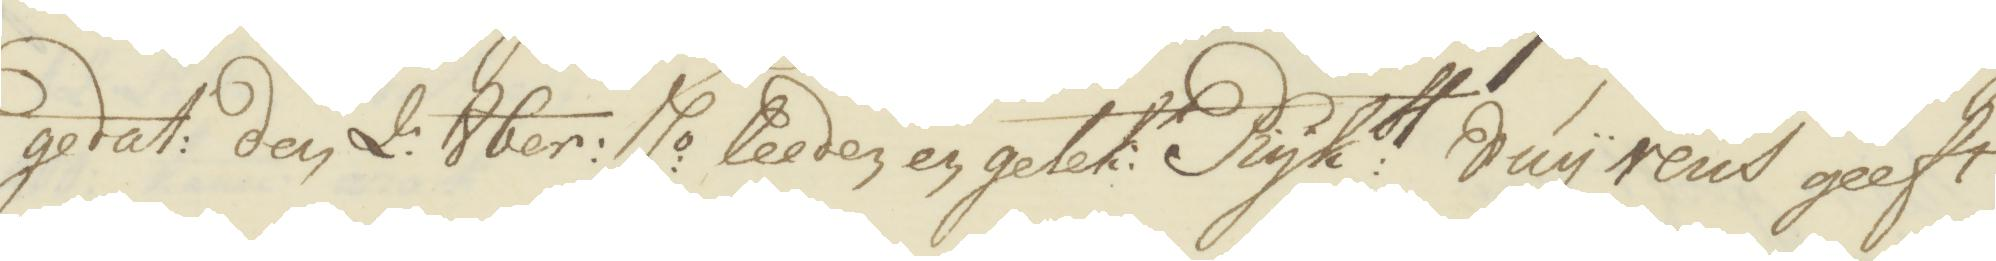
gedat: den 2: 8ber: J:o leeden en getek:t Rijk:st duijvens geeft
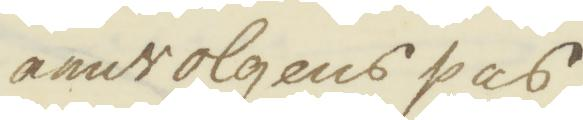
aan volgens pas
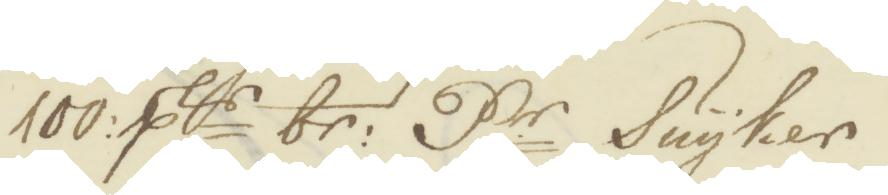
100: pl=s br: P=r suijker
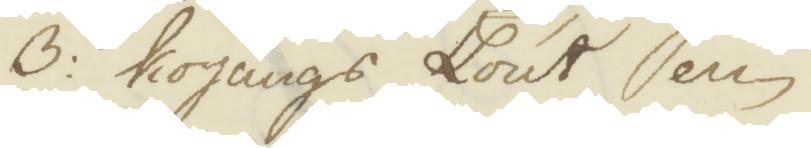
3: kojangs zout en
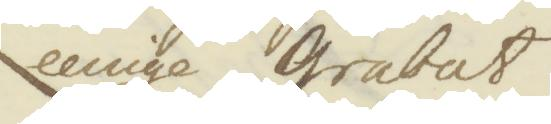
eenige Grabat
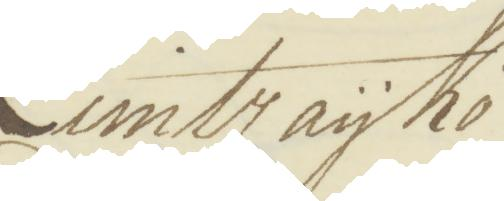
Limtj aijko
